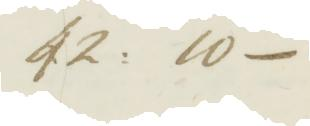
42: 10 —
